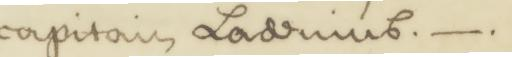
capitain Ladenius. —.
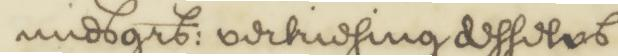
midsgrs: verkiesing desselvs
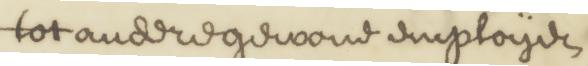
tot andere gewone emploijen
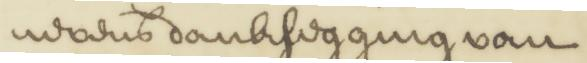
nevens danksegging van
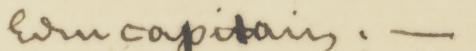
hem capitain. —
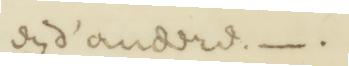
en d’ andere. —.
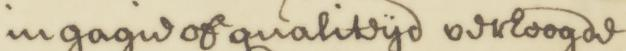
in gagie of qualiteijd verhoogde
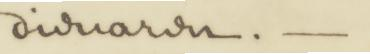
dienaren. —
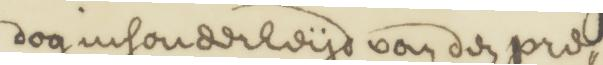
dog insonderheijd van den pre„
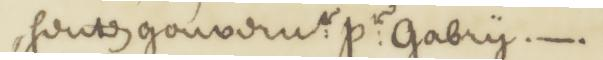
„senten gouvern:r p:r gabrij.—.
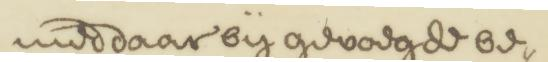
med daar bij gevoegde be„
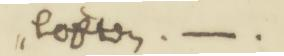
„loften.—.
